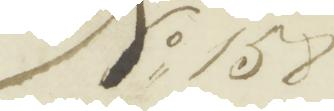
N„o 158
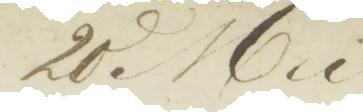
20.e Mei
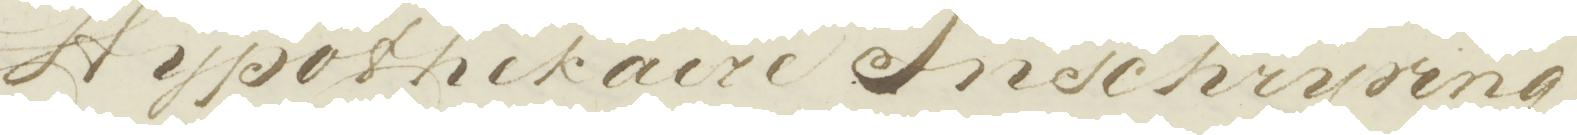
Hypothekaire Inschryving
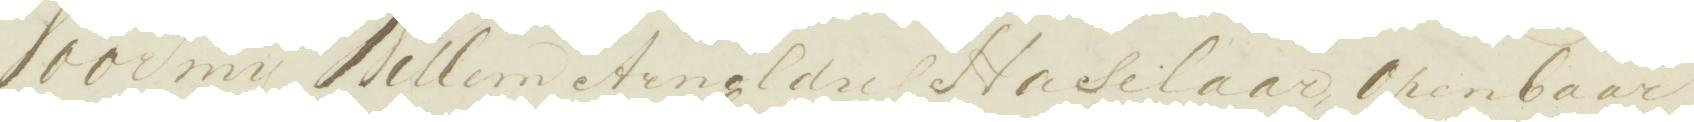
Voor my Willem Arnoldus Haselaar, Openbaar
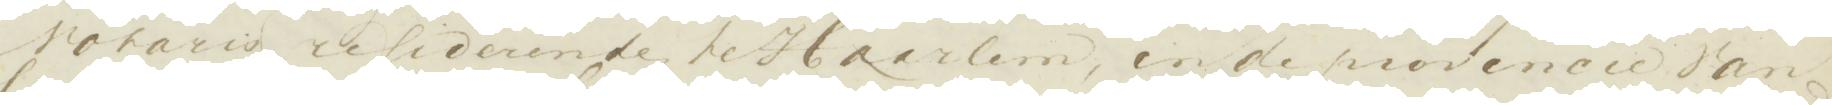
Notaris, residerende, te Haarlem, in de provincie Van
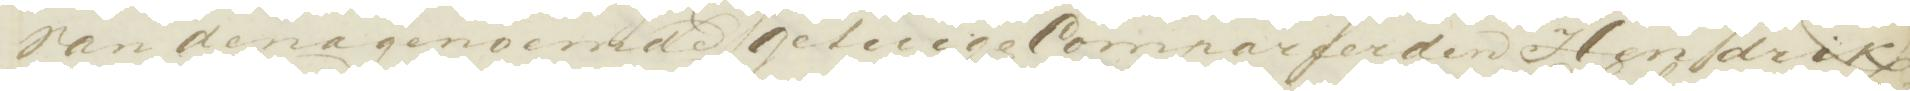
van denagenoemde getuigen Compareerden Hendrik
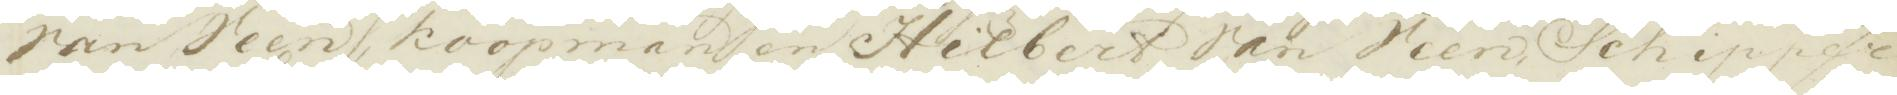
van Veen, koopman en Hilbert van Veen, Schipper
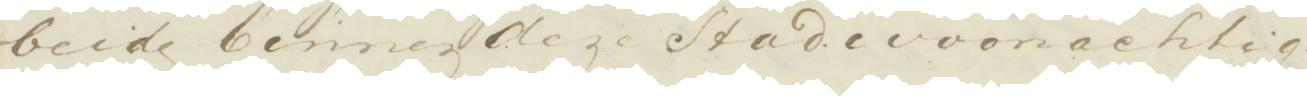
beide binnen deze Stad woonachtig
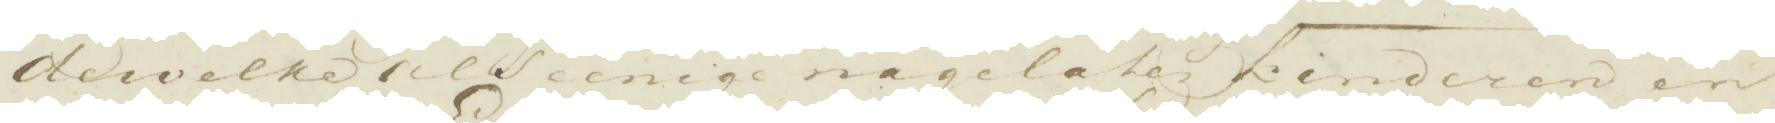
dewelke als eenige nagelaten kinderen en
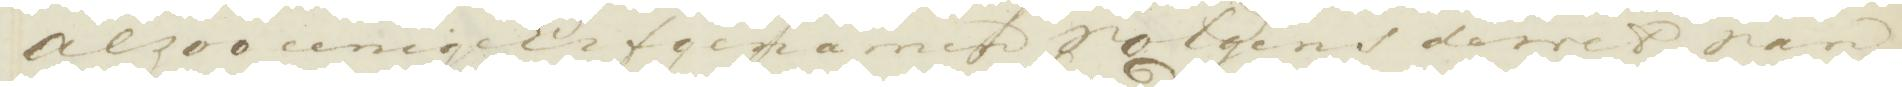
alzoo eenige Erfgenamen volgens de wet van
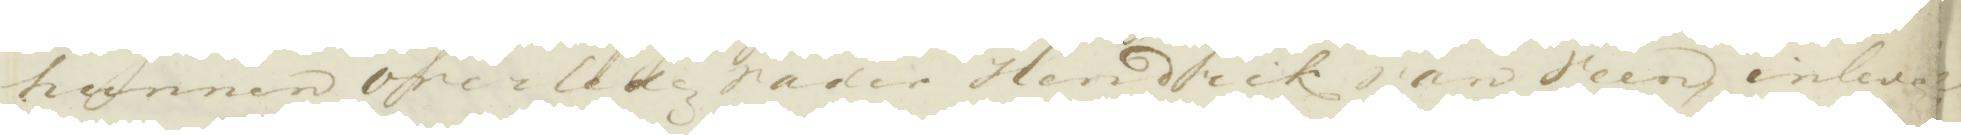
hunnen overleden vader Hendrik van Veen inleve
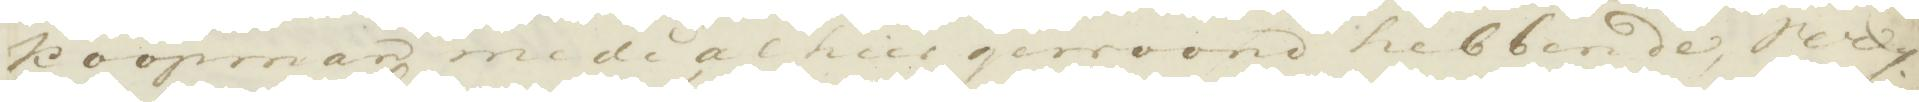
koopman mede alhier gewoond hebbende, Ver„
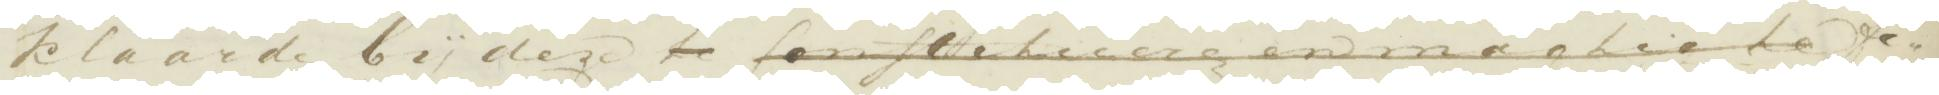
klaarde bij deze te Constitueren en magtig te fi„
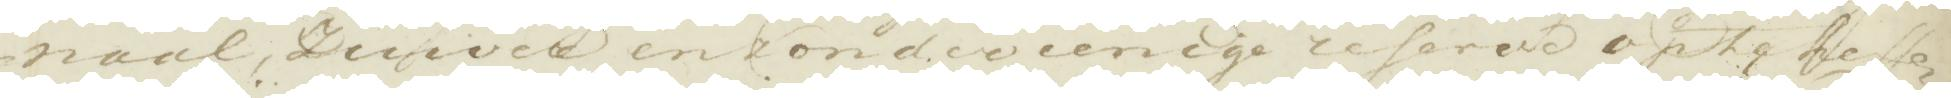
„naal, zuiver en zonder eenige reserve op te heffen
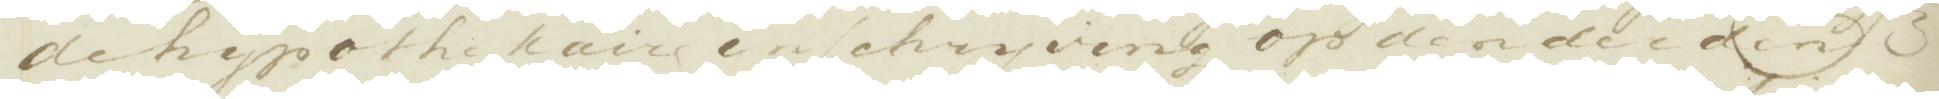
de hijpothekaire inschryving op den derden
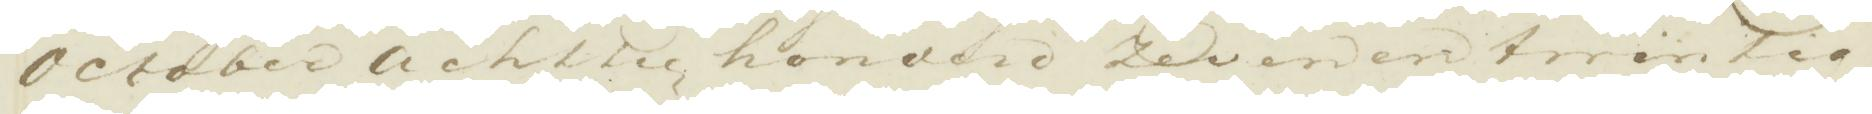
October achttien honderd zeven en twintig
